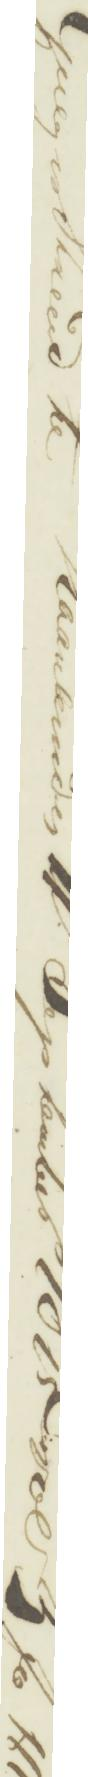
Geregistreerd te Haarlemden 11:e September 1815 vol 3 fo 111
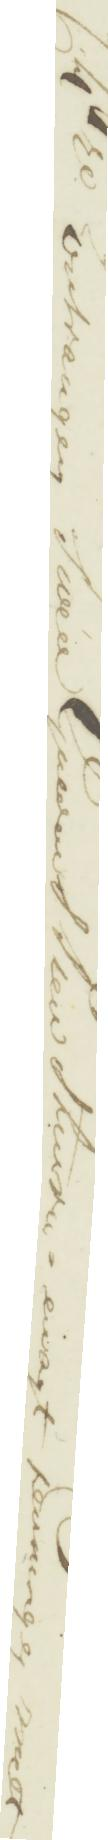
4r:l ontvangen Twee Guldens tien stuivers- en agt penningen, met
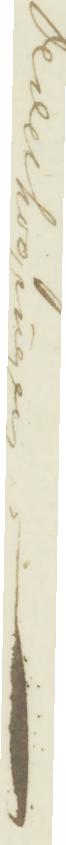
de verhogingen
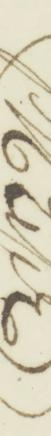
PHEsser
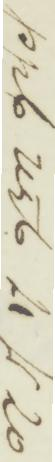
ppC regt 4 st 20
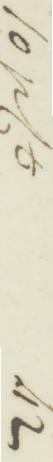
10 pC:t 42
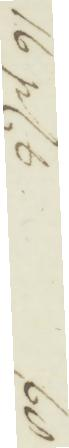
16 pC:t 68
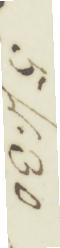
5 st .30
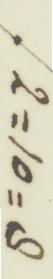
ƒ 2=10=8
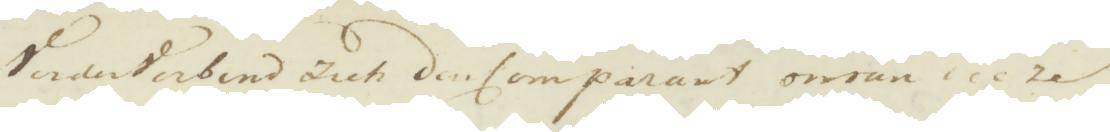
Verder verbind zich den comparant om van deeze
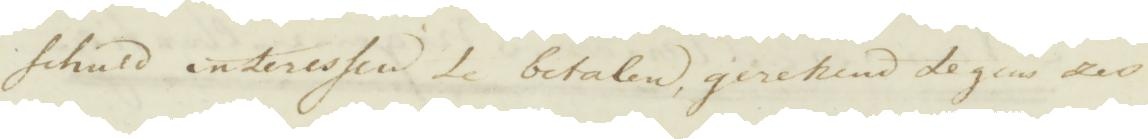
schuld interessen te betalen, gerekend tegens zes
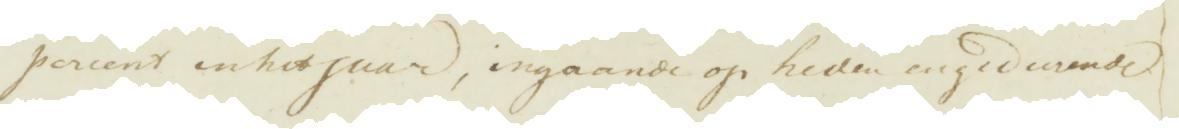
percent in het jaar, ingaande op heden en gedurende
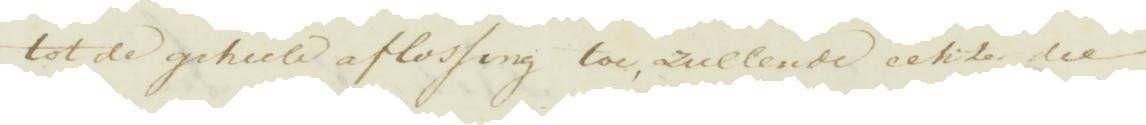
tot de geheele aflossing toe, zullende echter die
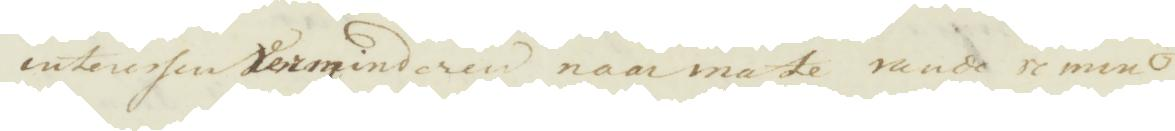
interessen verminderen naar mate van de ve min
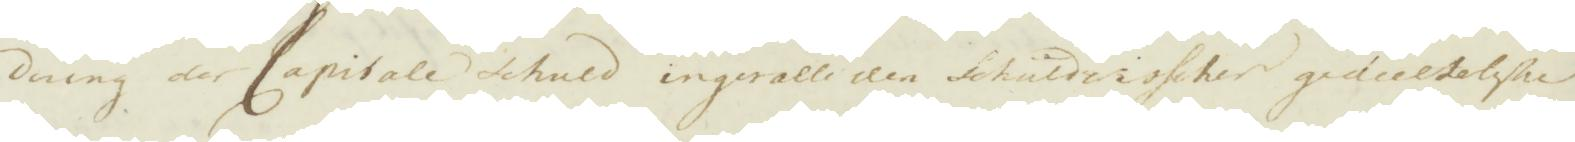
dering der Capitale schuld ingevalle den schuldeisscher gedeeltelyke
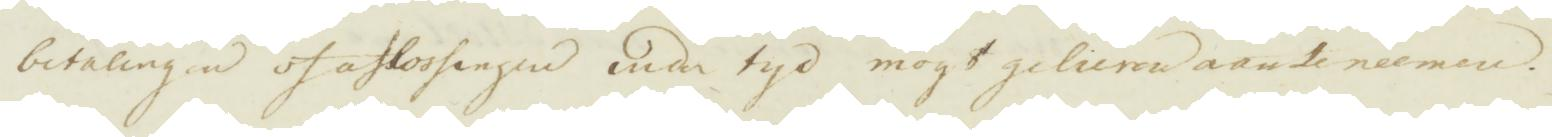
betaling en of aflossingen inder tyd mogt gelieven aan te neemen
